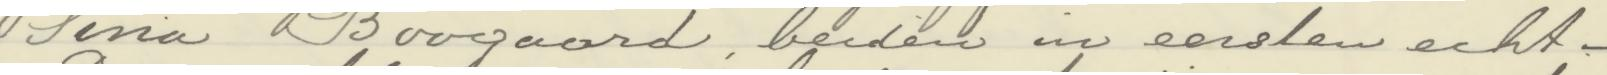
sina Boogaard, beiden in eersten echt
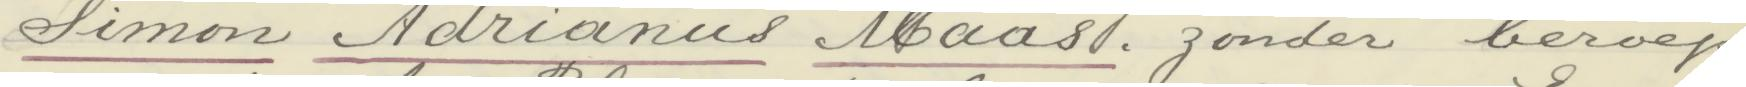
Simon Adrianus Maas, zonder beroep
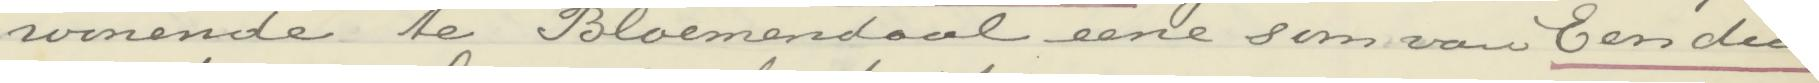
wonende te Bloemendaal eene som van Een dui
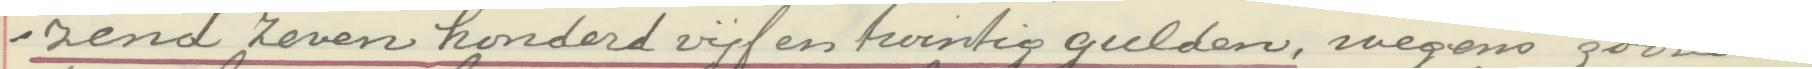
-zend zeven honderd vijf en twintig gulden, wegens zoovele
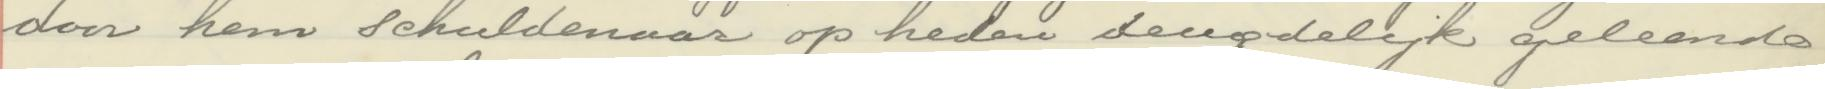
door hem schuldenaar op heden deugdelijk geleende
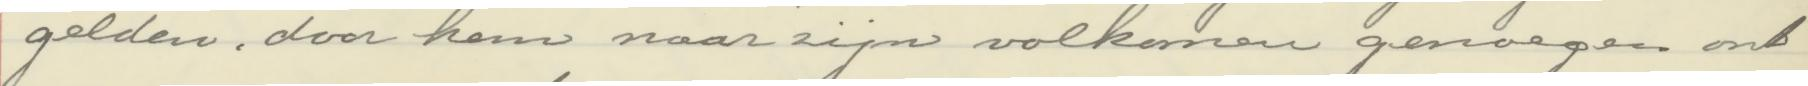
gelden, door hem naar zijn volkomen genoegen ont
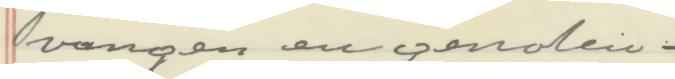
vangen en genoten
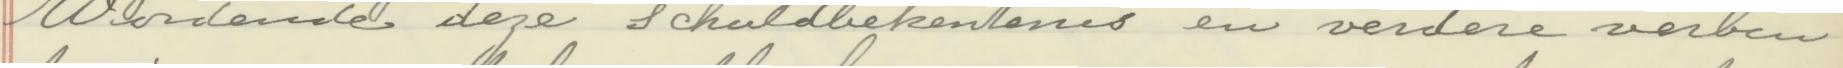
Wordende deze schuldbekentenis en verdere verbin
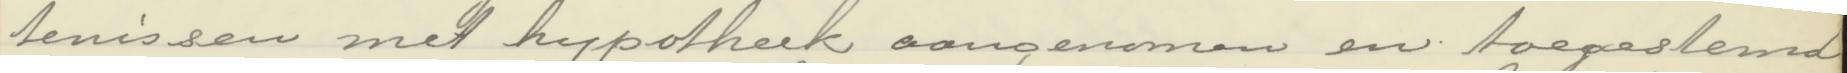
tenissen met hypotheek aangenomen en toegestemd
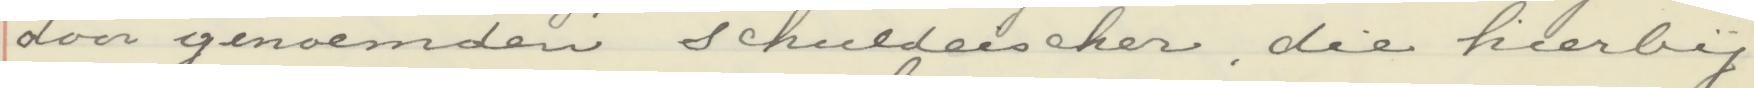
door genoemden schuldeischer, die hierbij
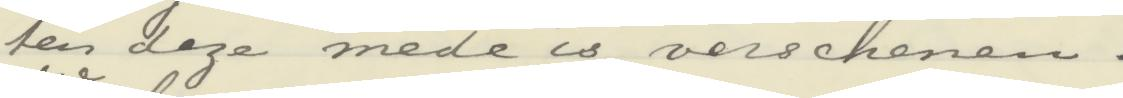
ten deze mede is verschenen
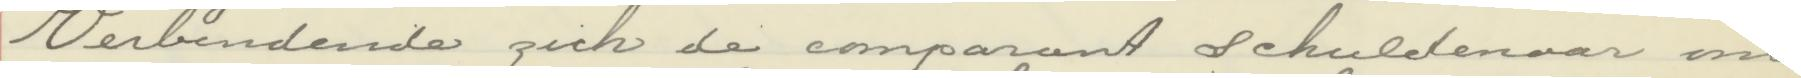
Verbindende zich de comparant schuldenaar om
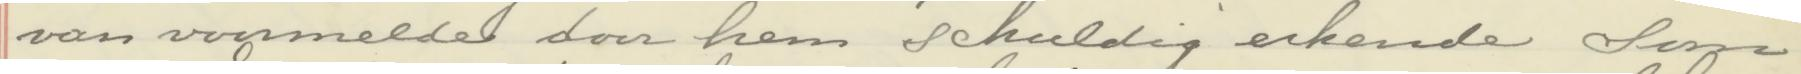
van voormelde door hem schuldig erkende Som
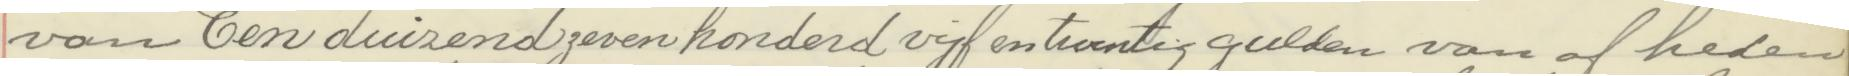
van Een duizend zeven honderd vijf en twntig gulden van af heden
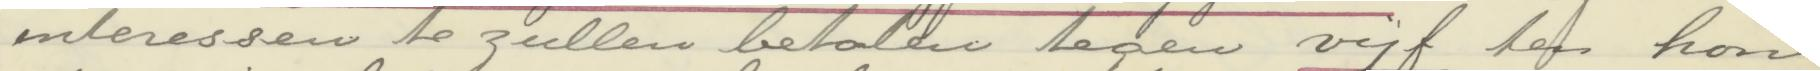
interessen te zullen betalen tegen vijf ten hon
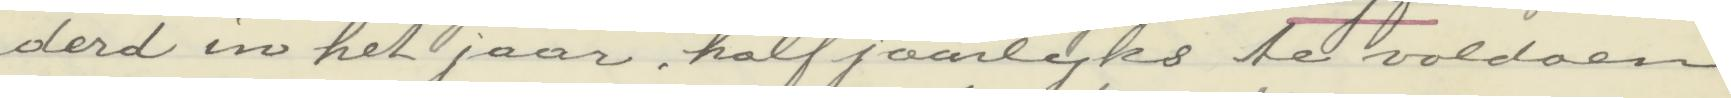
derd in het jaar, halfjaarlyks te voldoen
